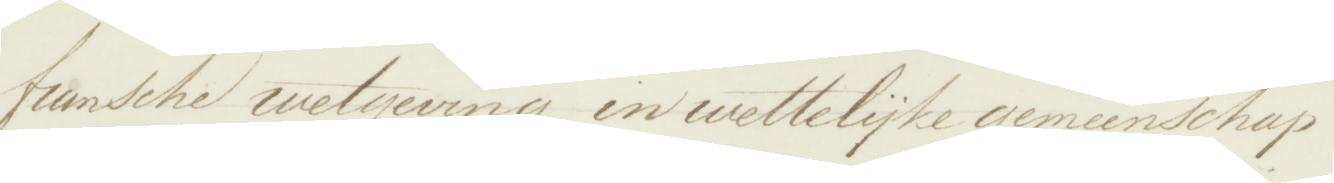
fransche wetgeving in wettelijke gemeenschap
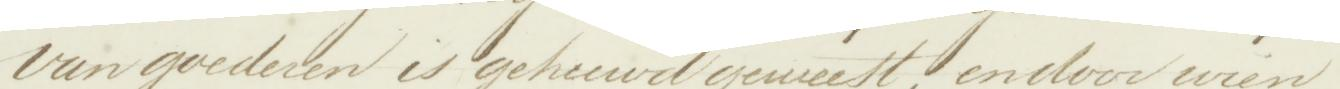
van goederen is gehuwd geweest, en door wien
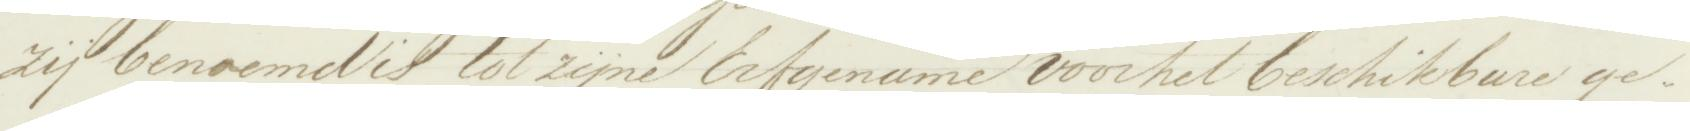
zij benoemd is tot zijne Erfgename voor het beschikbare ge„
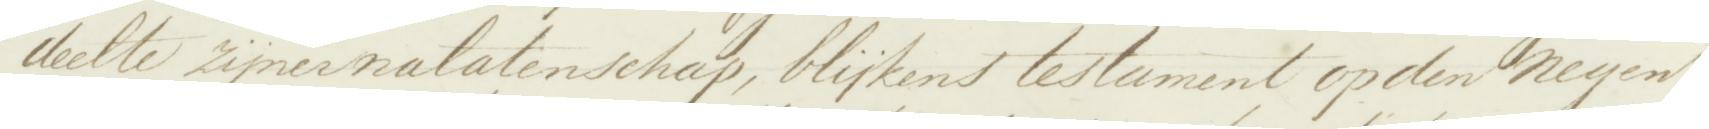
deelte zijner nalatenschap, blijkens testament op den negen
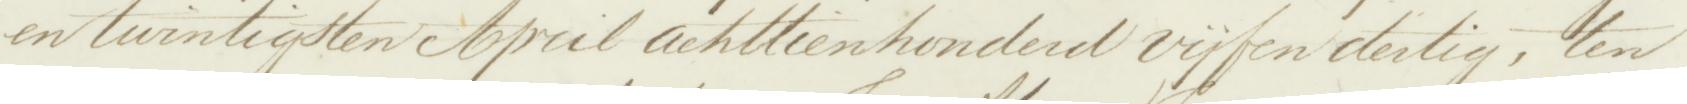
en twintigsten April achttienhonderd vijfendertig, ten
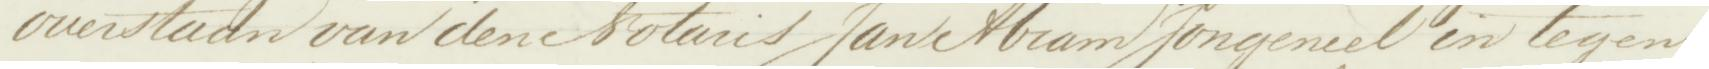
overstaan van den Notaris Jan Abram Jongeneel in tegen
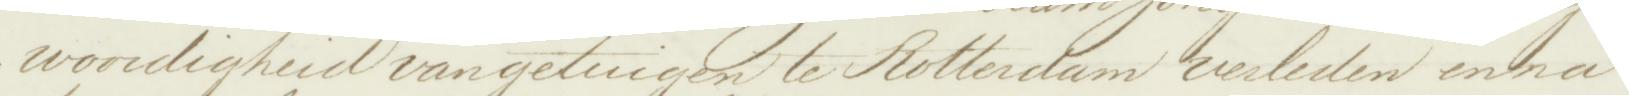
„woordigheid van getuigen te Rotterdam verleden en na
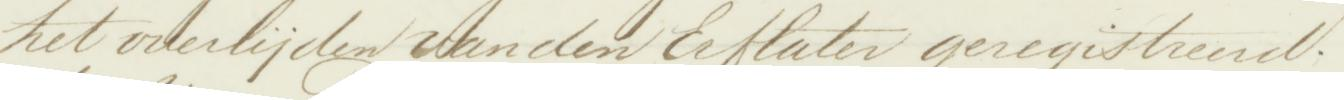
het overlijden van den Erflater geregistreerd.
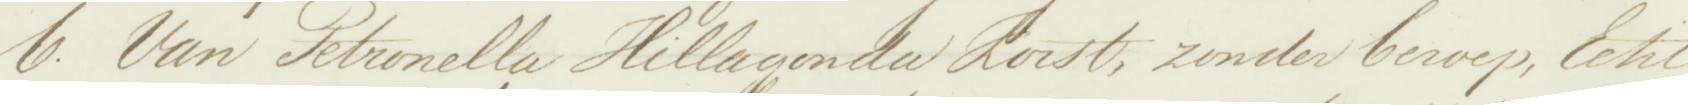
b. van Petronella Hillagonda Korst, zonder beroep, Echt
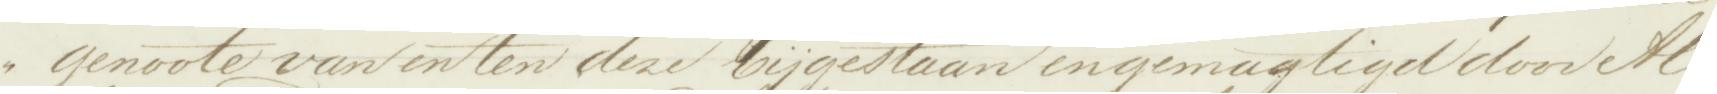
„genoote van en ten deze bijgestaan en gemagtigd door Al
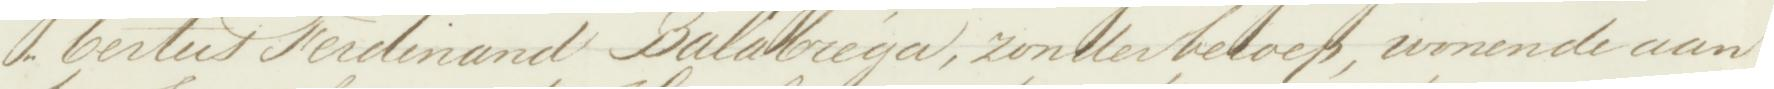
bertus Ferdinand Balabréga, zonder beroep, wonende aan
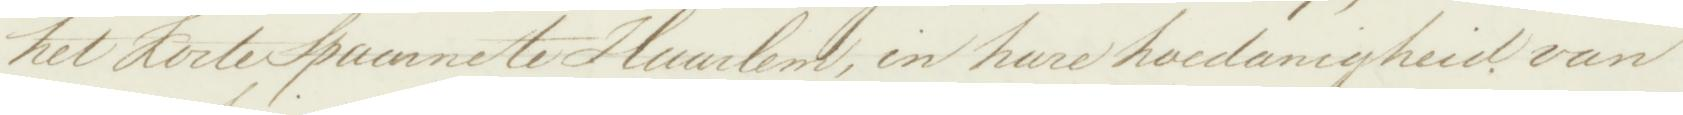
het Korte Spaarne te Haarlem, in hare hoedanigheid van
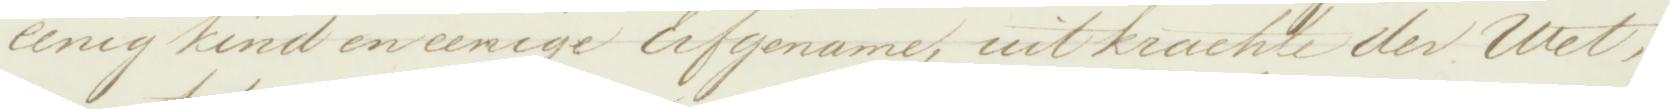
eenig kind en eenige Erfgename, uit krachte der Wet,
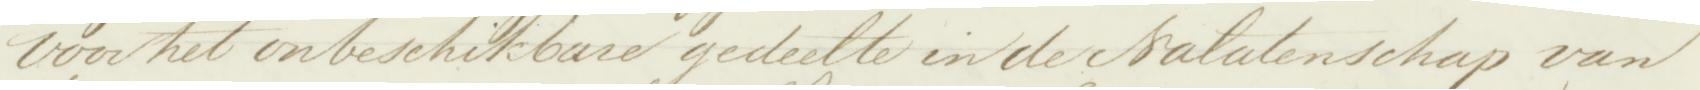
voor het onbeschikbare gedeelte in de Nalatenschap van
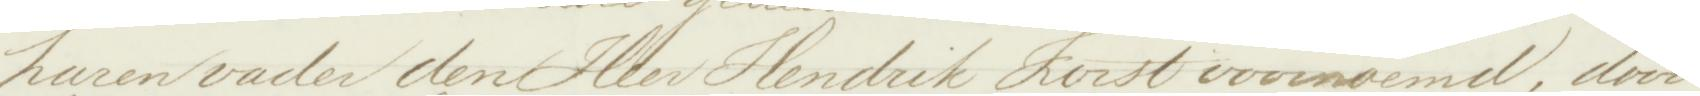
haren vader den Heer Hendrik Korst voornoemd, door
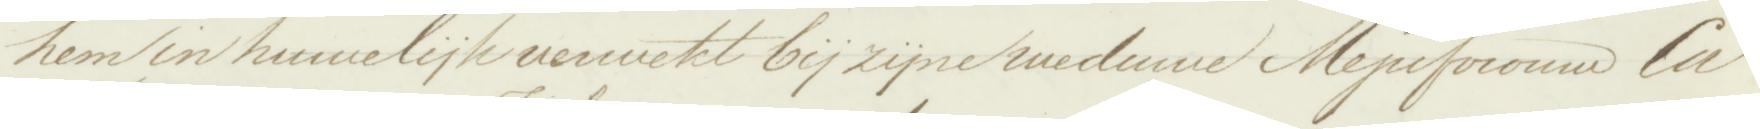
hem in huwelijk verwekt bij zijne weduwe Mejufvrouw Ca
